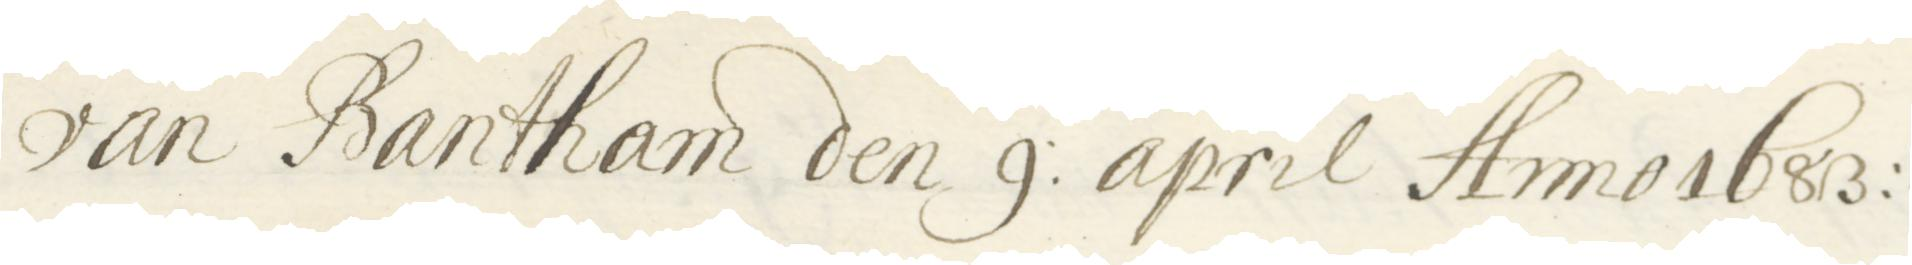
van Bantham den 9: april Anno 1683:
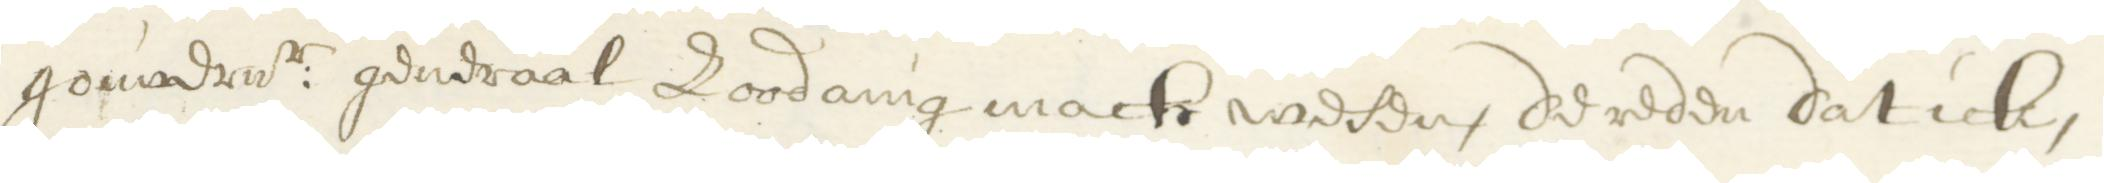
gouvern:r generaal zoodanig mach wesen, de reden dat ick,
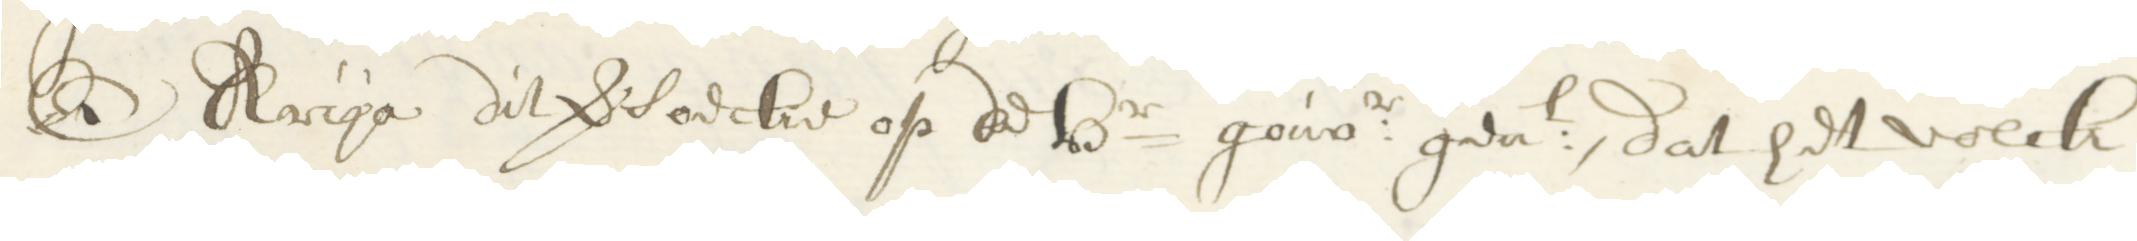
ende Krija, dit versoecke op de H=r gouv:r gen:l, dat het volck
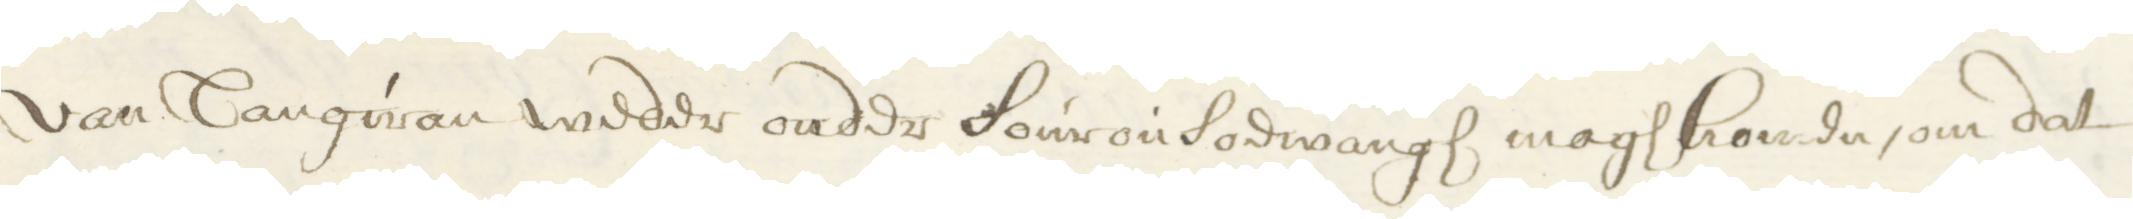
van Tanguran weder onder Sourousoewangh magh komen, om dat
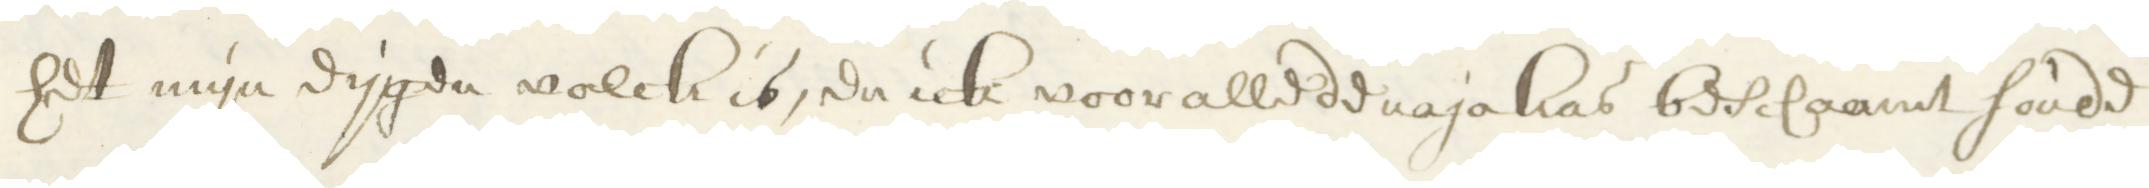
het mijn eijgen volck is, en ick voor alle de najakas beschaamt soude
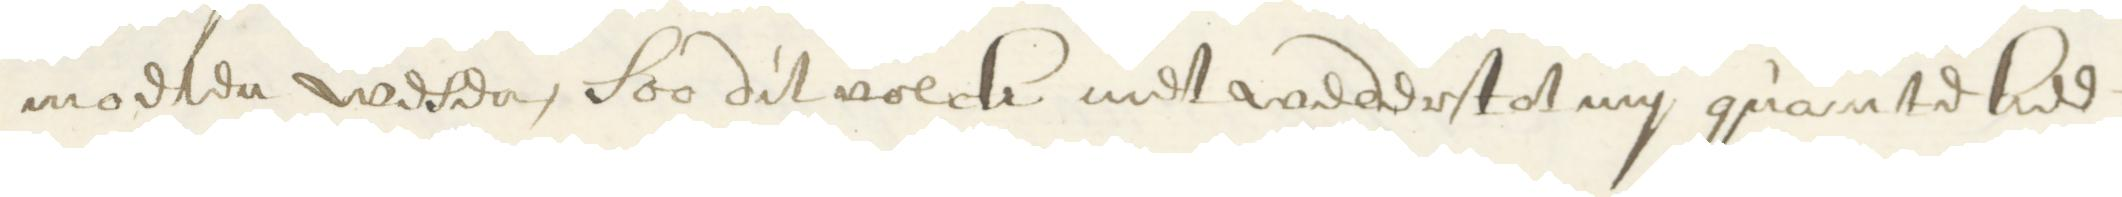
moeten wesen, soo dit volck niet weder tot mij quam te kee
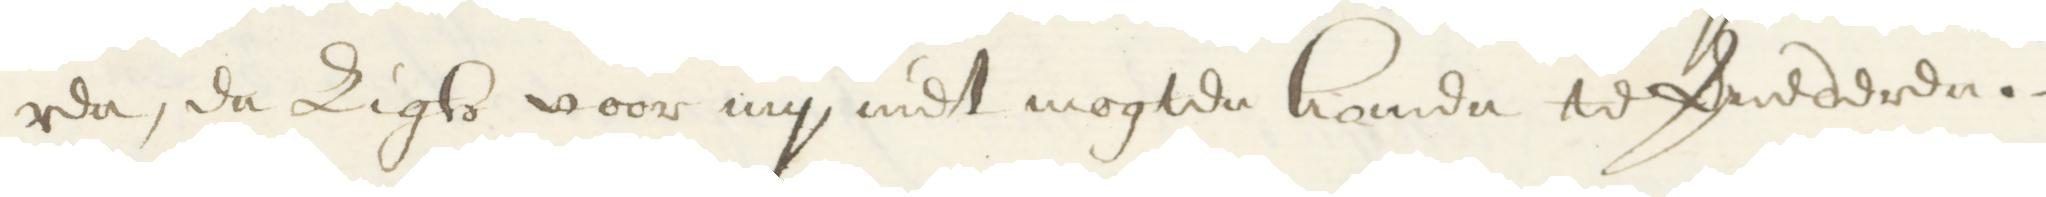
ren, en zigh voor mij niet mogten komen te vernederen.
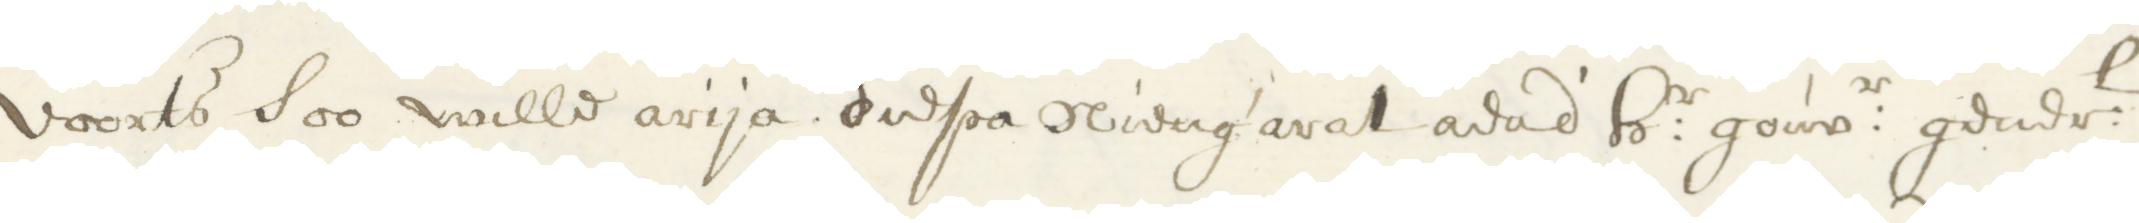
voorts soo wille arija diepa Nieng'arat aend' h:r gouv:r gener:l
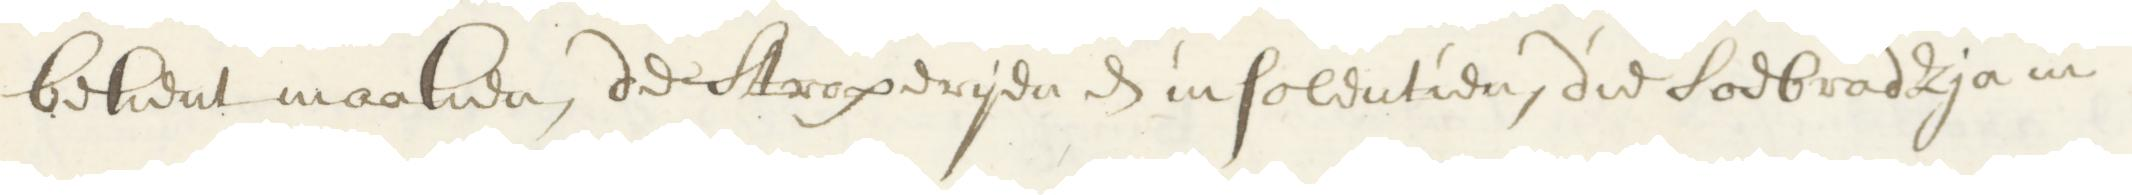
bekent maaken, de stroperijen en insolentien, die soebradzja in
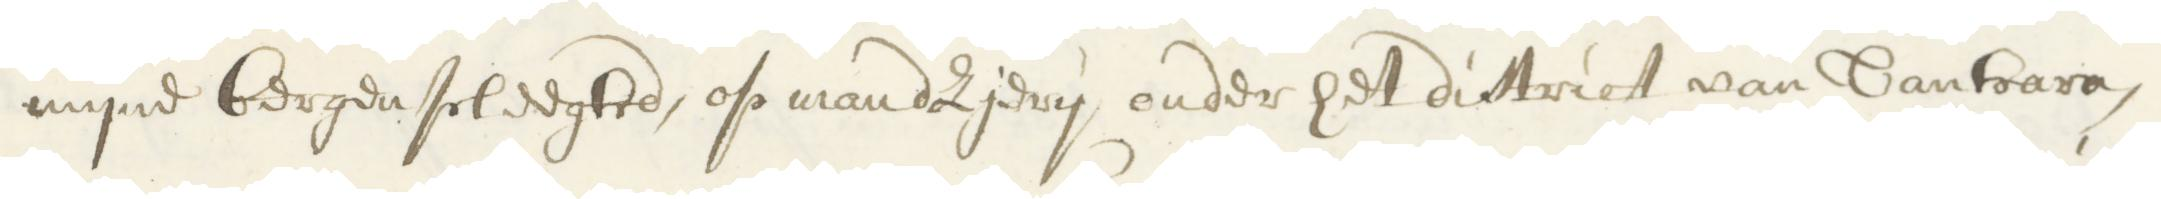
mijne bergen pleeghd, op mandzjerij onder het district van Tanhara,
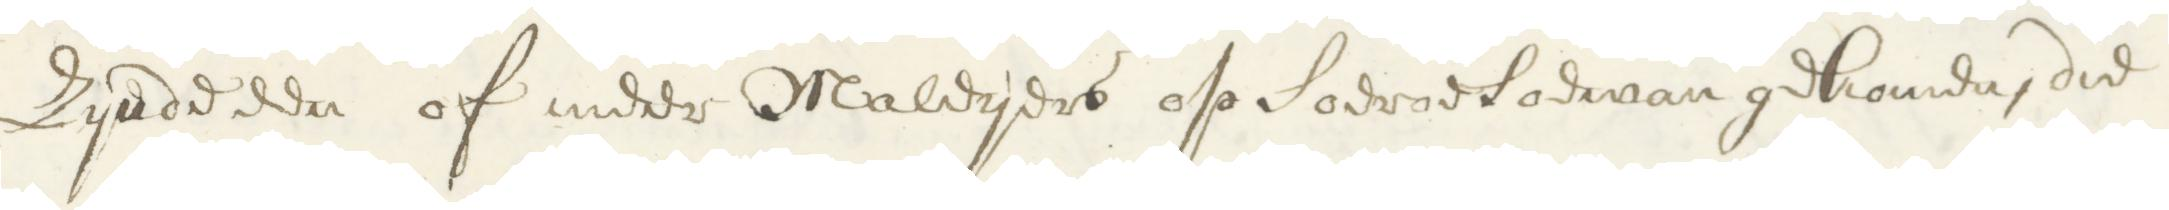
zijnde een of meer Maleijers op soeroesoewan gekomen, die
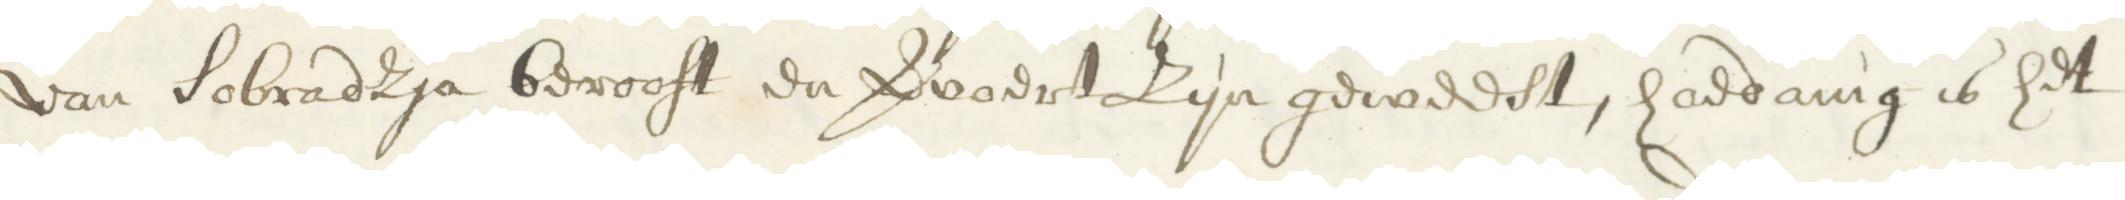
van sobradzja berooft en vervoert zijn geweest, hoedanig is het
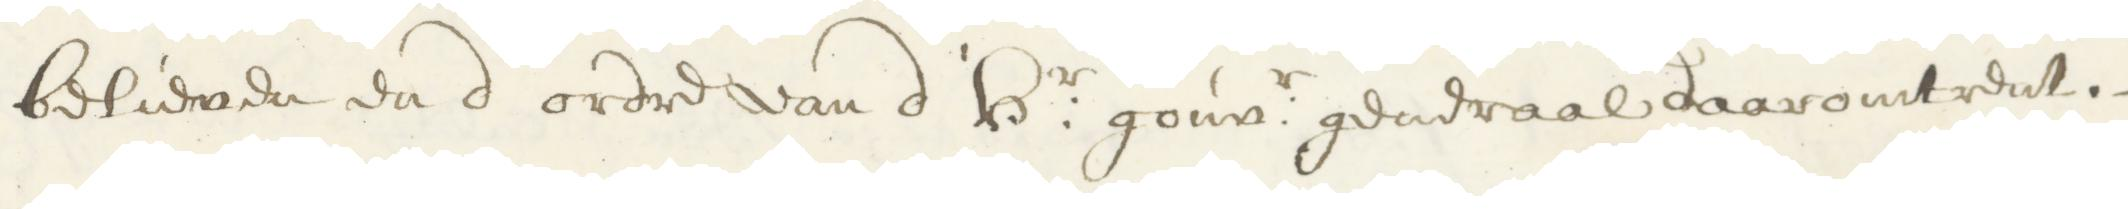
believen en d' ordre van d' H:r gouv:r generaal daaromtrent.
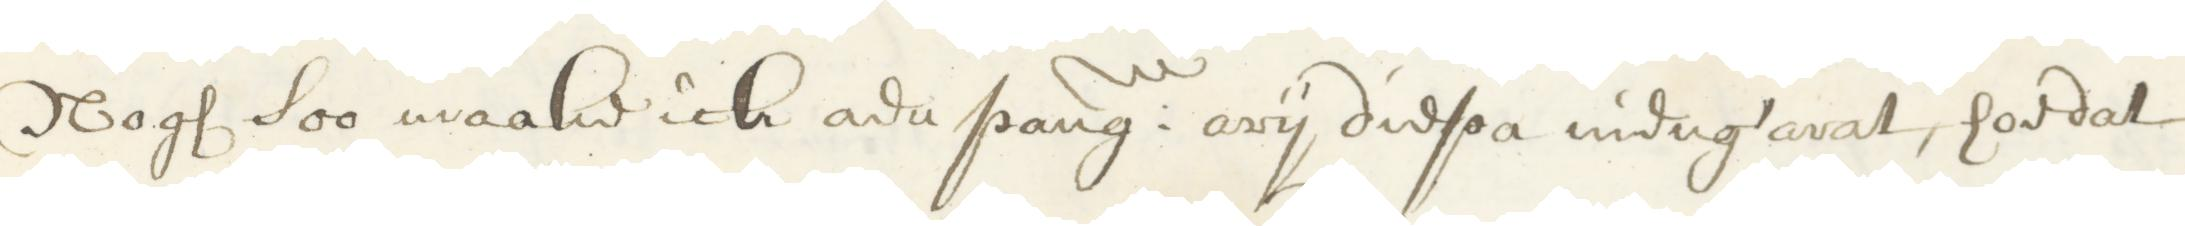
Nogh soo maake ick aen pang: arij diepa nieng'arat, hoe dat
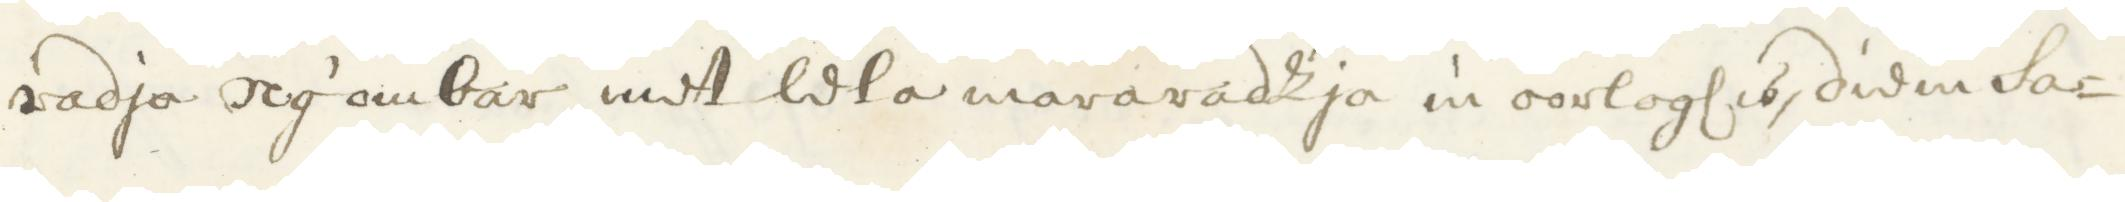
radja Ng'ombar met lela mararadzja in oorlogh is, die in sas=
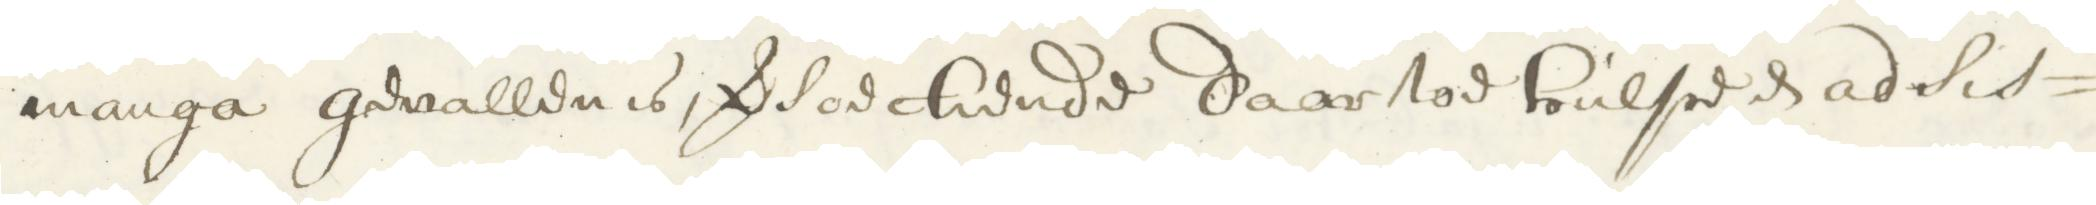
manga gevallen is, versoeckende daar toe hulpe en adsis=
